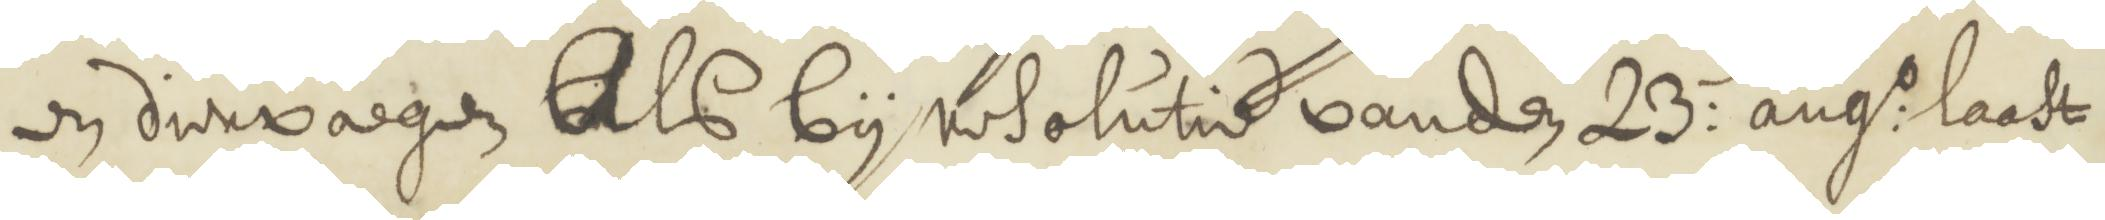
en diervoegen Als bij resolutie van den 23:' aug:o laast
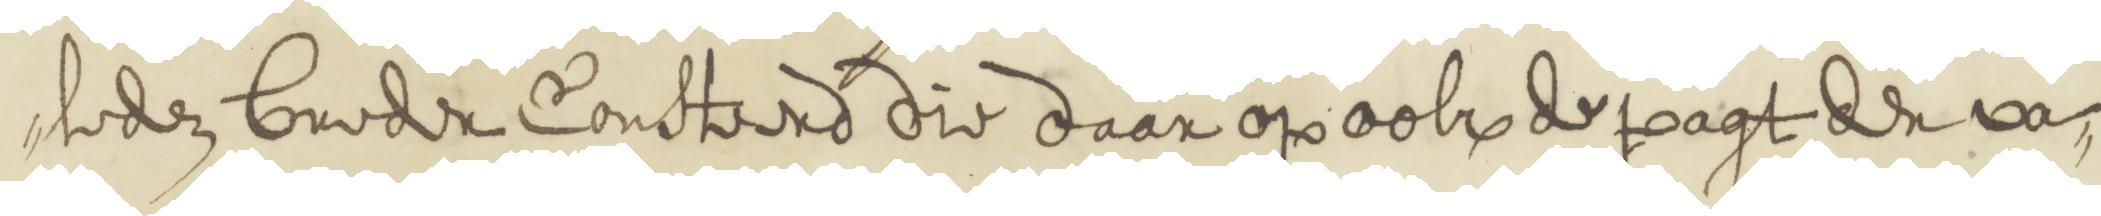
„leden breder Consteerd die daar op ook de pagt der va„
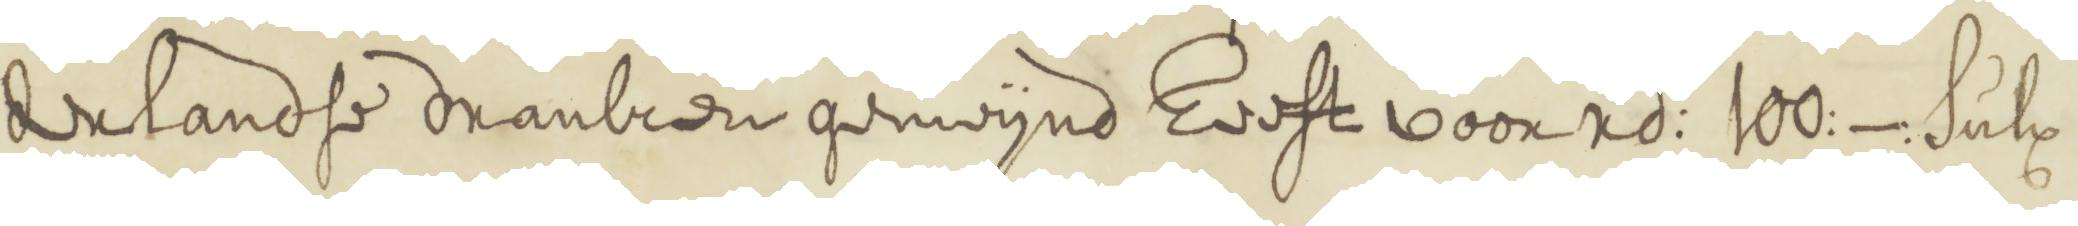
derlandse dranken gemeijnd heeft voor rd:s 100:—: Sulx
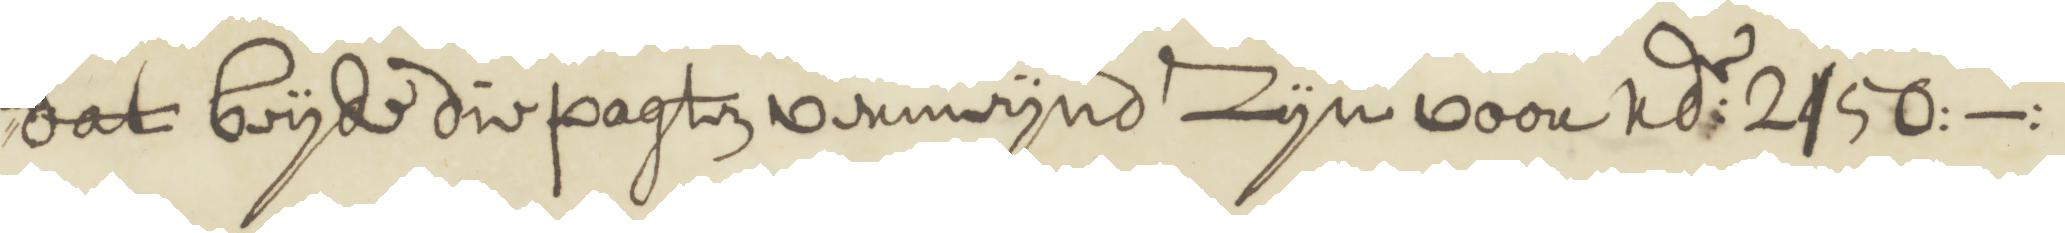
dat beijde die pagten vermeijnd Zijn voor rd:s 2450:—:
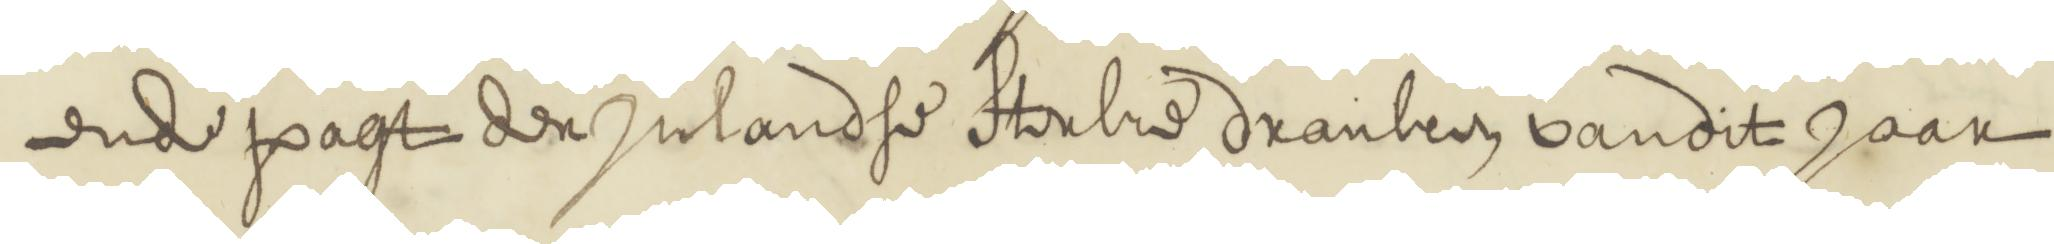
ende pagt der Jnlandse Sterke dranken van dit jaar
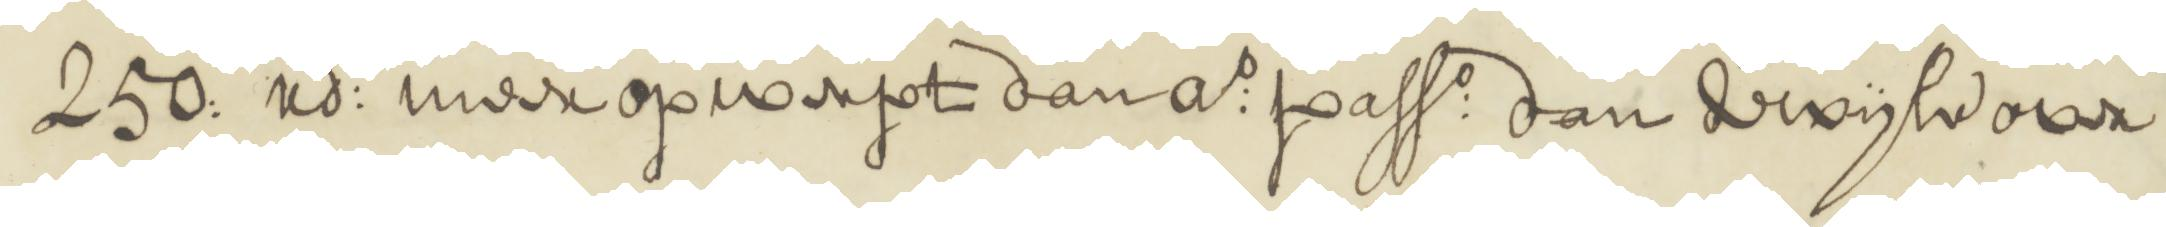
250: rd:s meer op werpt dan a:o pass:o dan de wijle over
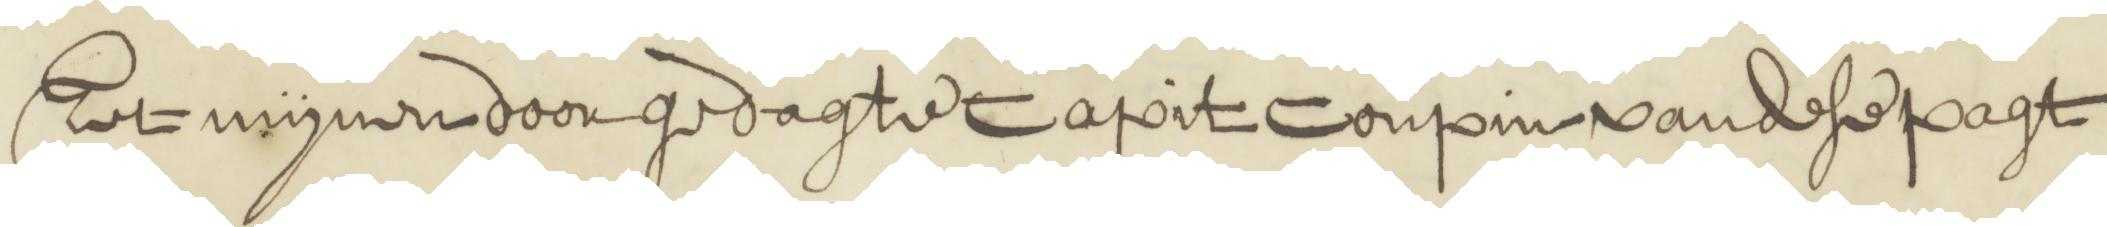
het mijnen door gedagte Capit Coupin van dese pagt
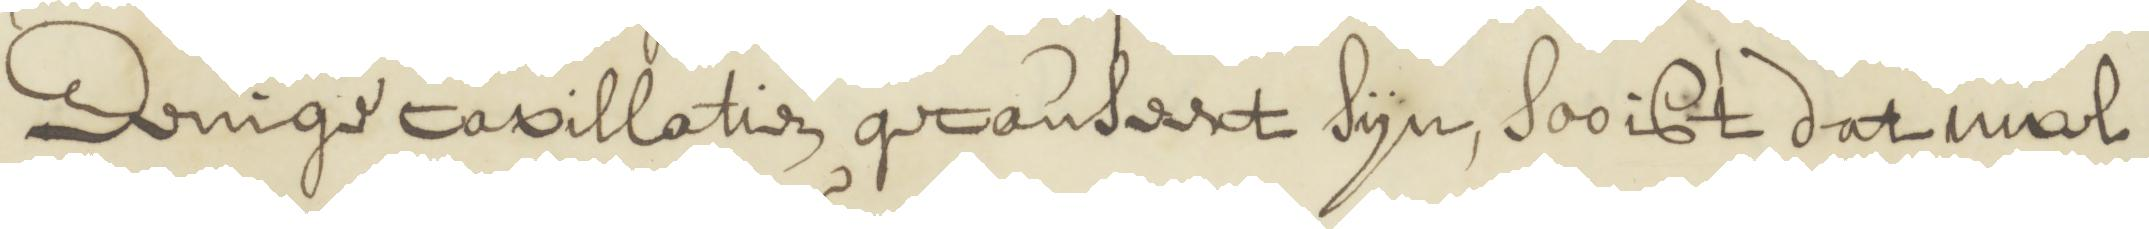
Eenige cavillatien gecauseert Sijn, Soo ist dat uwel
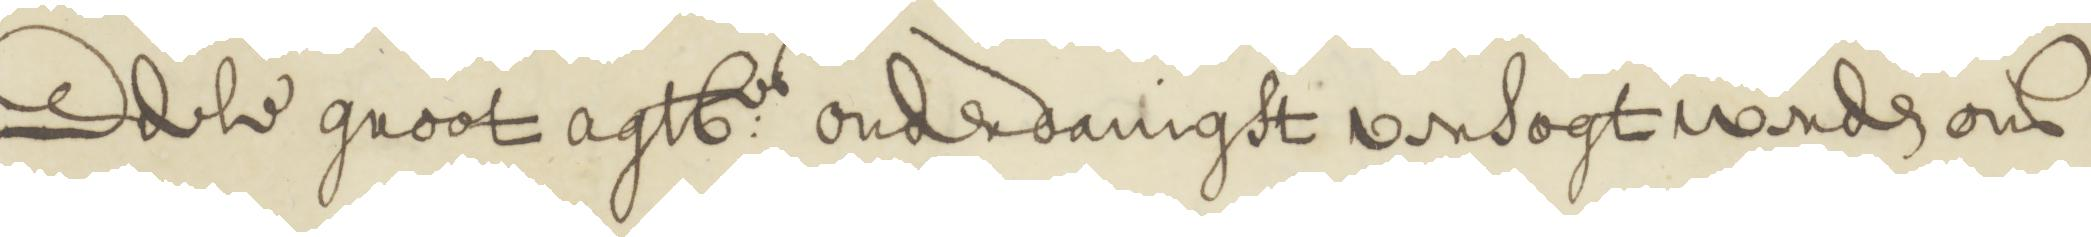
Edele groot agtb:es onderdanigst versogt werden ons
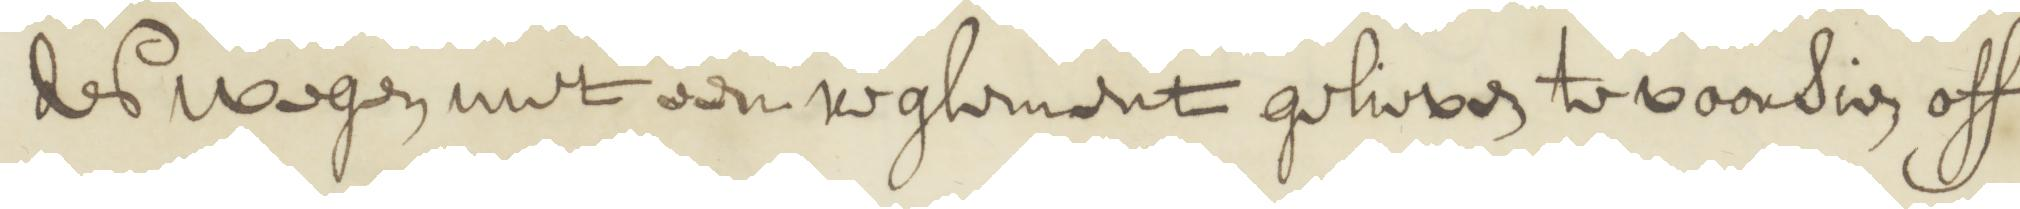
des wegen met een reglement gelieven te voorsien off
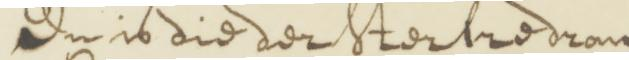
En is die der sterke dran
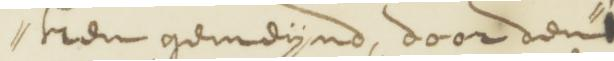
„ken gemeijnd, door den
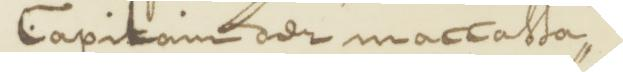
Capitain der maccassa„
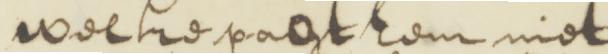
welke pagt hem niet
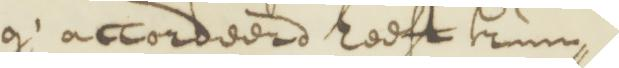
g’accordeerd heeft kun„
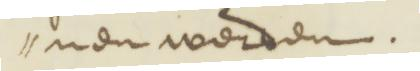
„nen werden.
